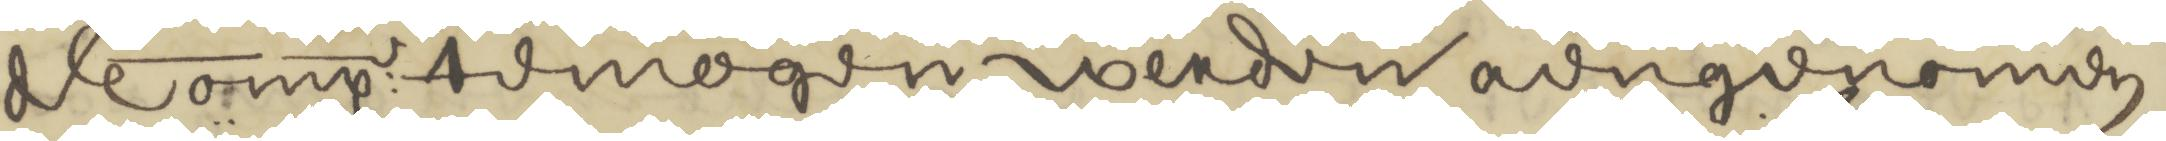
dEComp:s te mogen werden aengenomen
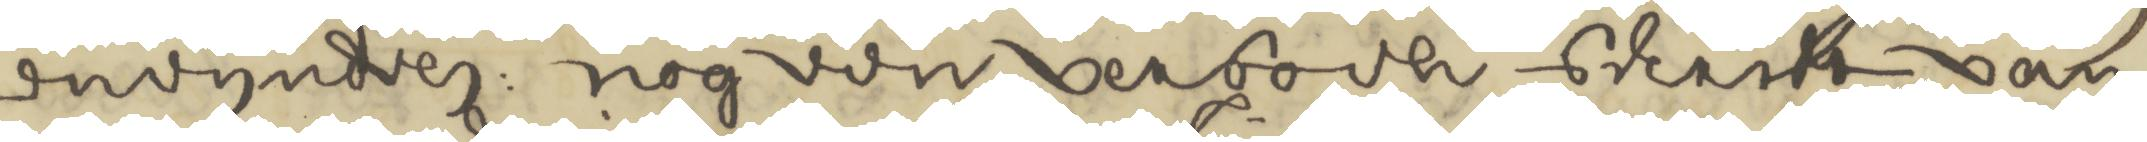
en eijndelijk nog een versoek schrift van
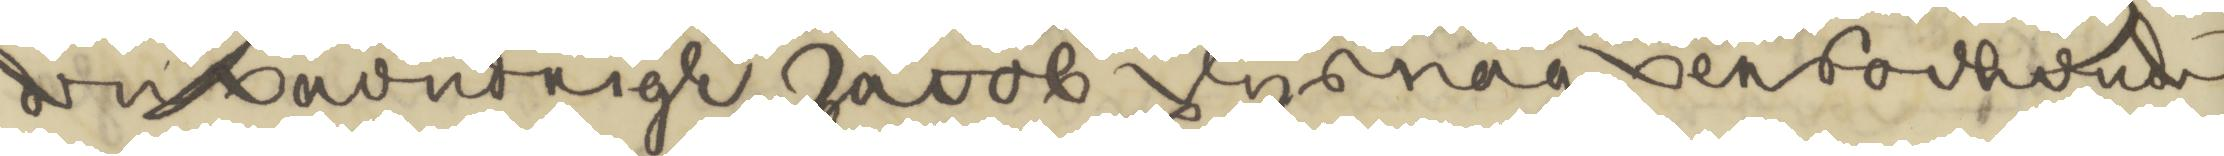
den vaendrigh Jacob Eijsnag versoekende
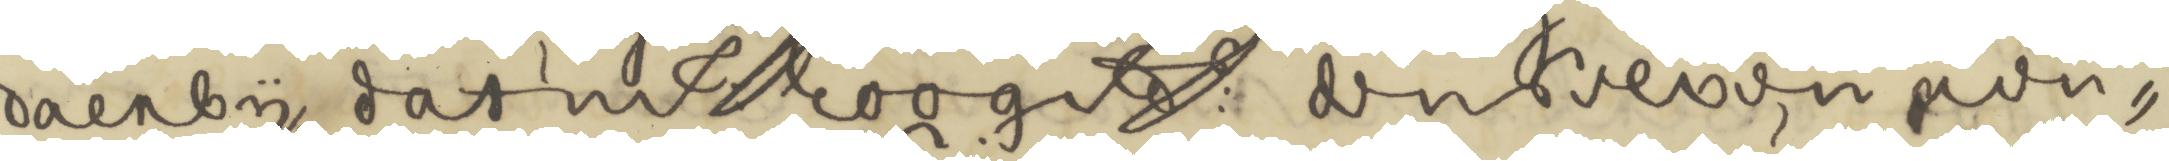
daerbij dat uE hoog Ed:s denselven aen„
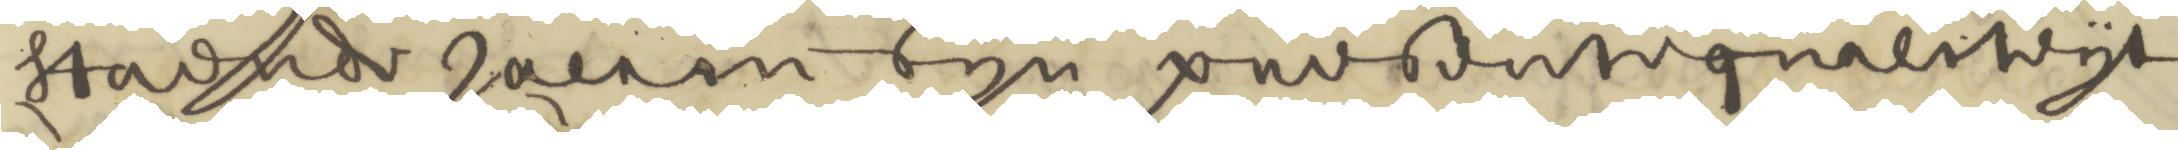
staende Jaer in sijn presente qualiteijt
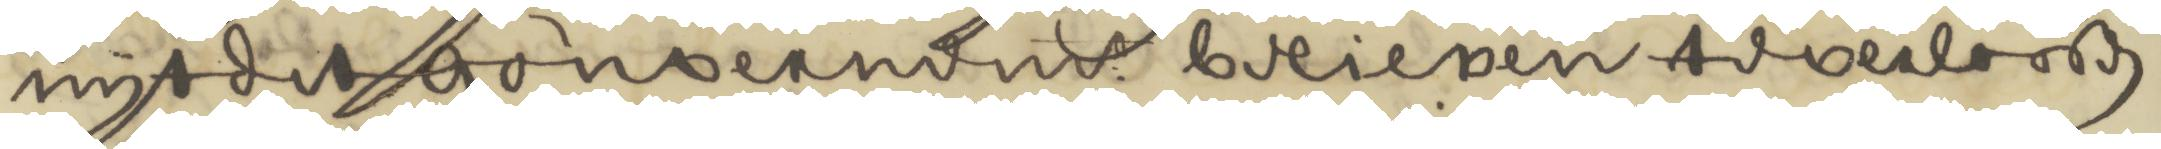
uijt dit gouvernem:t believen te verlossen
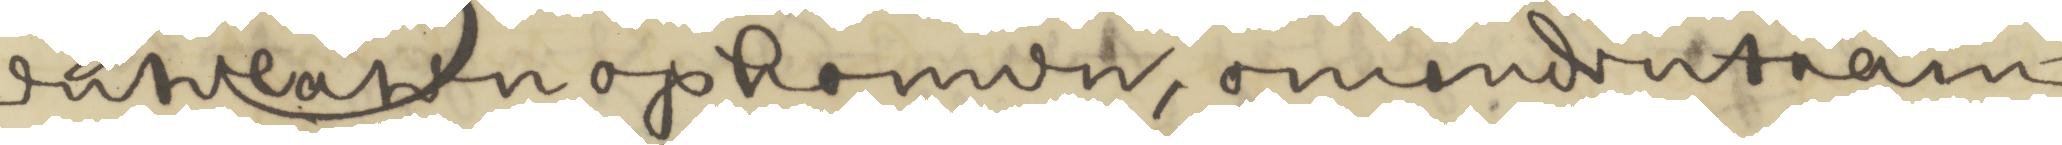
en te laten op komen, om in den train
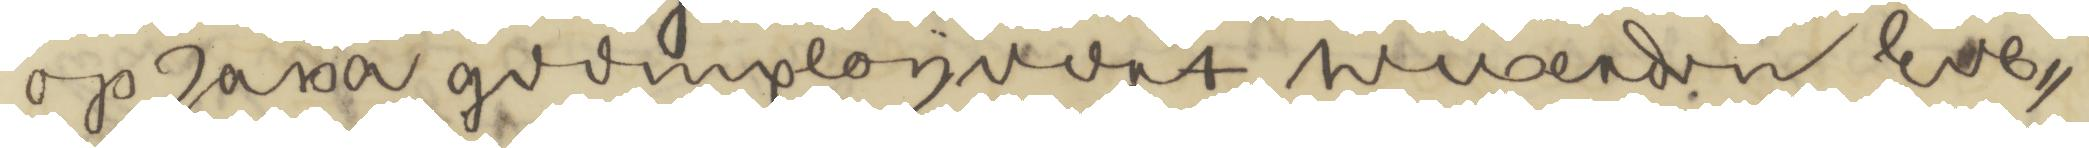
op Java geemploijeert te werden heb„
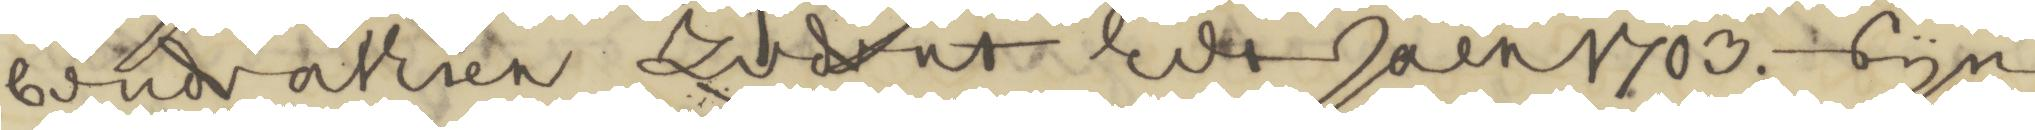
bende alhier zedert het Jaer 1703. sijn
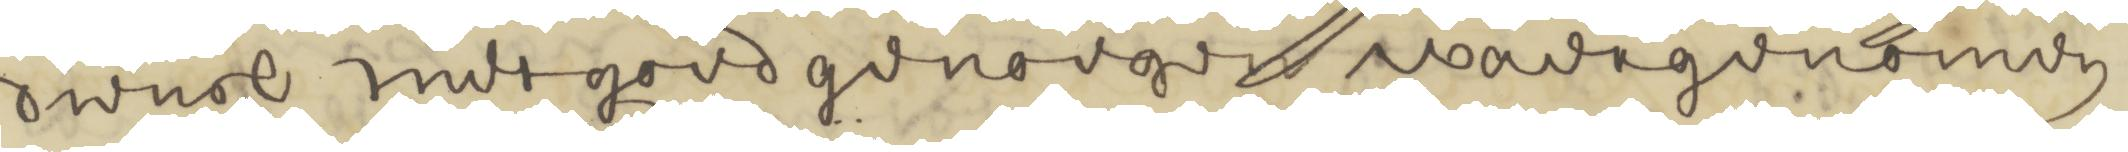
dienst met goed genoegen waergenomen
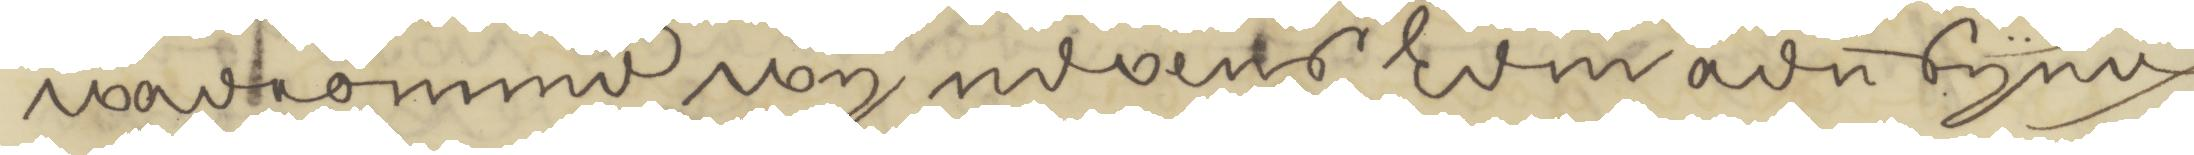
waeromme wij nevens hem aen sijne
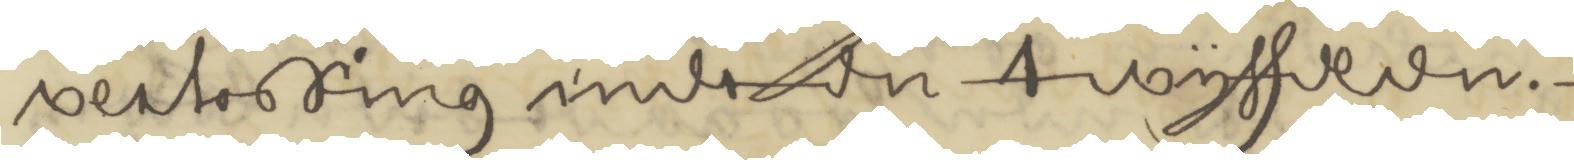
verlossing niet en twijffelen.
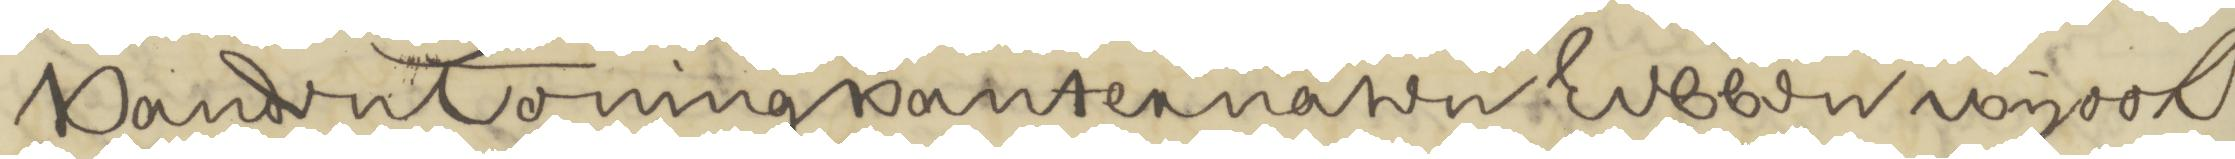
Van den Coning van ternaten hebben wij ook
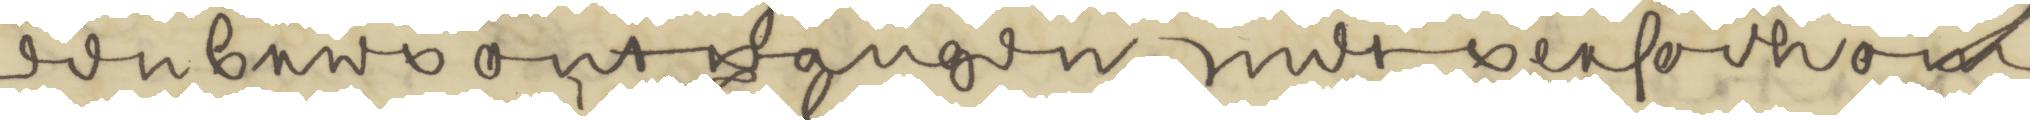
een briev ontfangen met versoek om
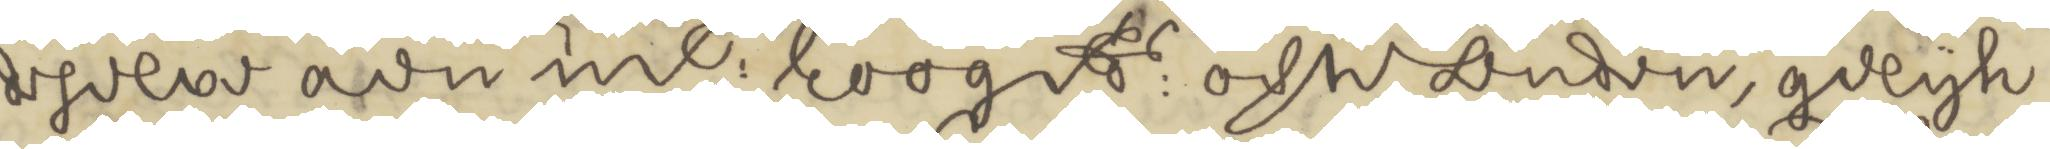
deselve aen uE: hoog Ed:s over te senden, gelijk
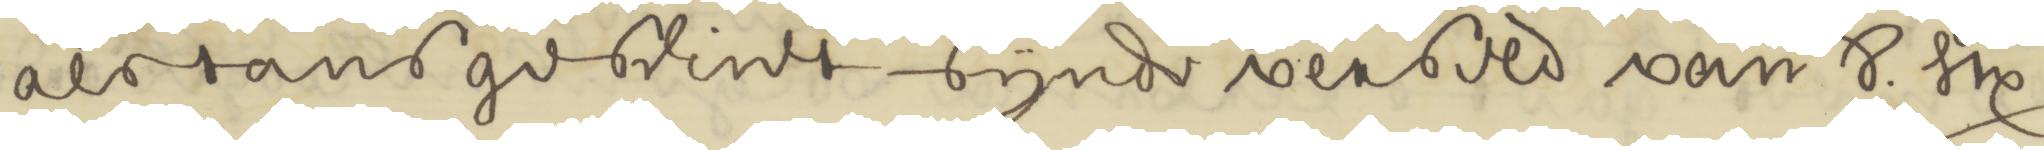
als tans geschiet sijnde verseld van 8. stx
